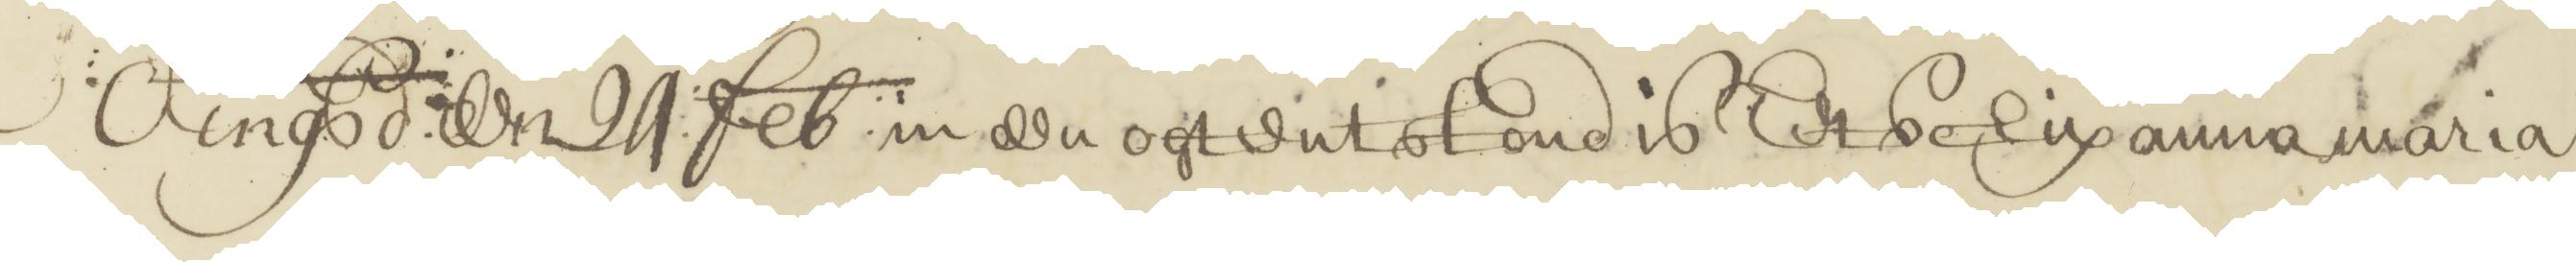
dingsd: den 24: feb: in den ogtentstond is het schip anna maria
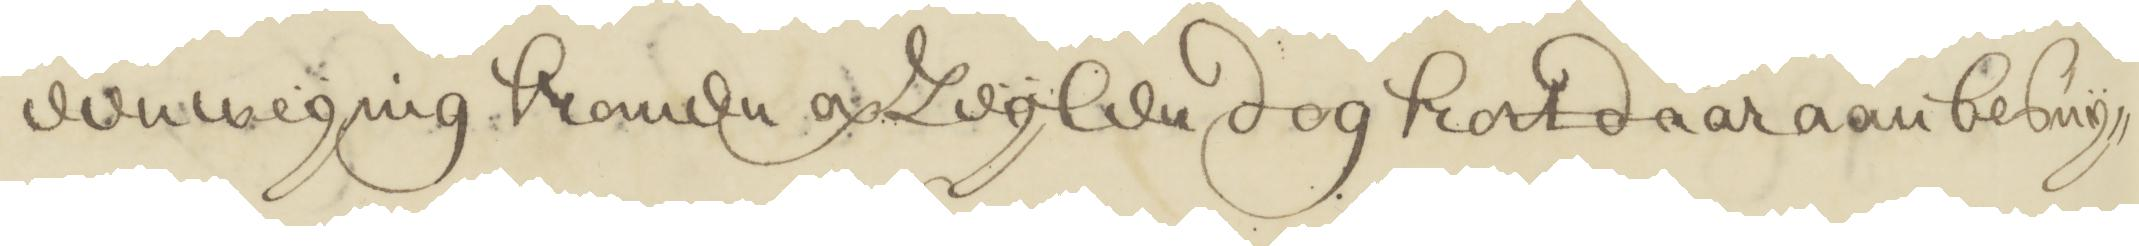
een weging komen opzeijlen dog kort daar aan besuij„
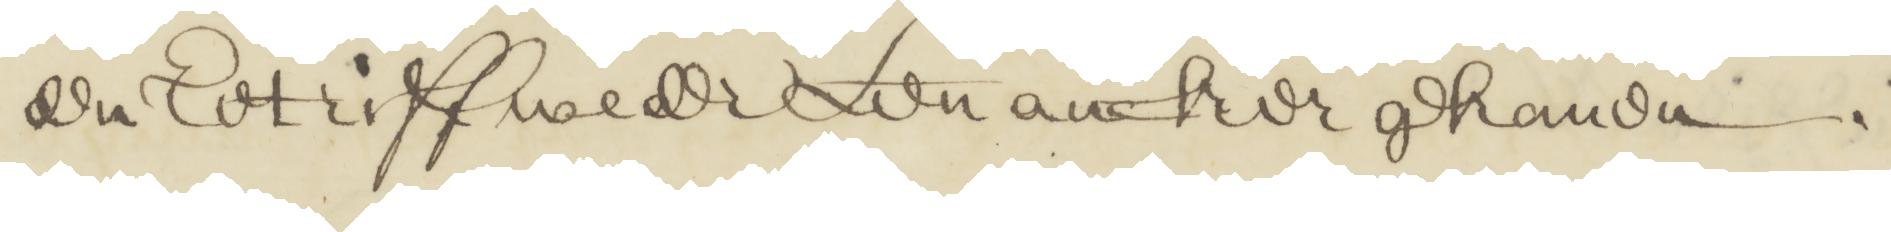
den het riff weder ten ancker gekomen.
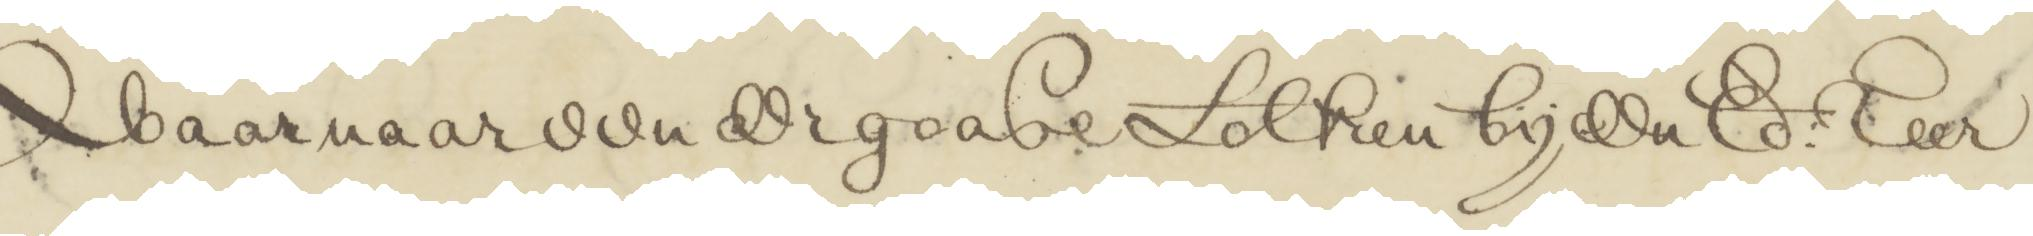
Waar naar een der goase tolken bij den Ed: heer
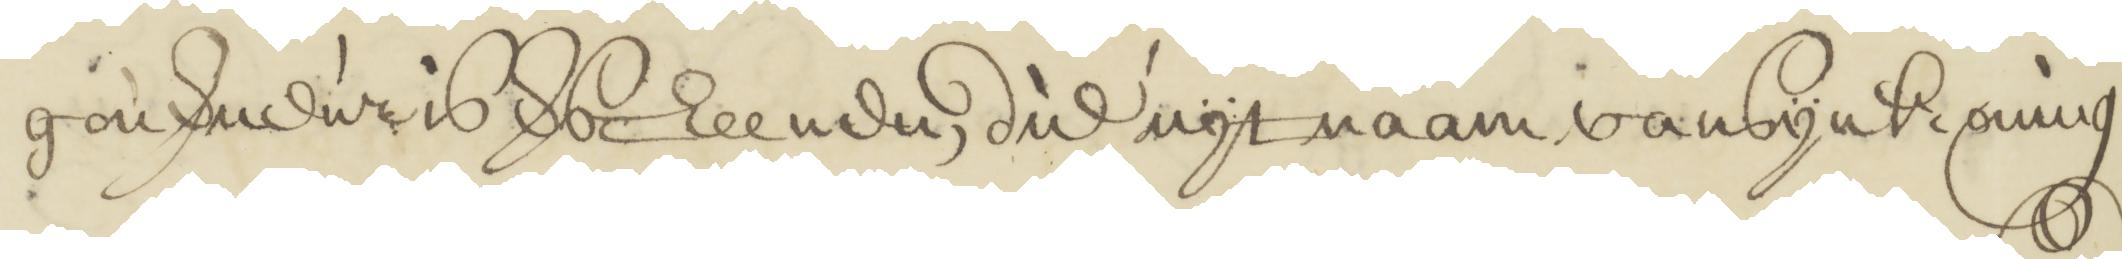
gouverneur is verscheenen, die uijt naam van sijn koning
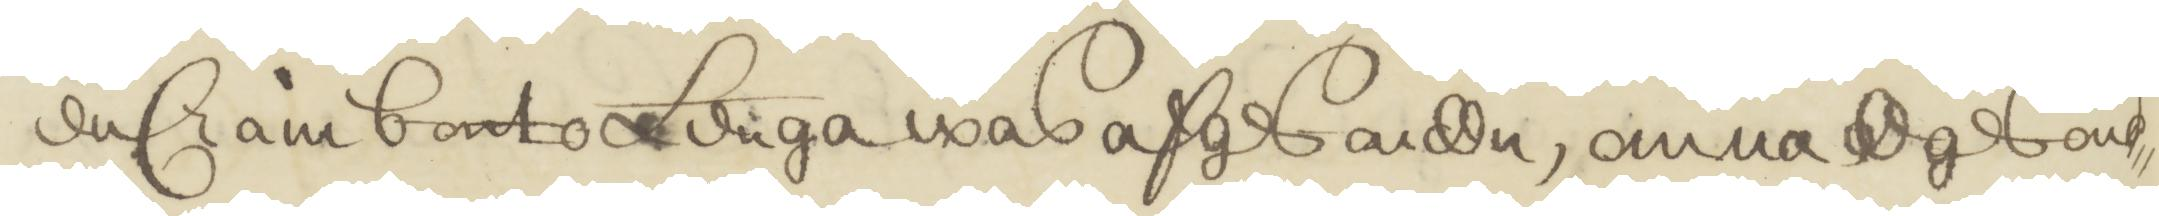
en Crain bonto tenga was afgesonden, om na de gesond„
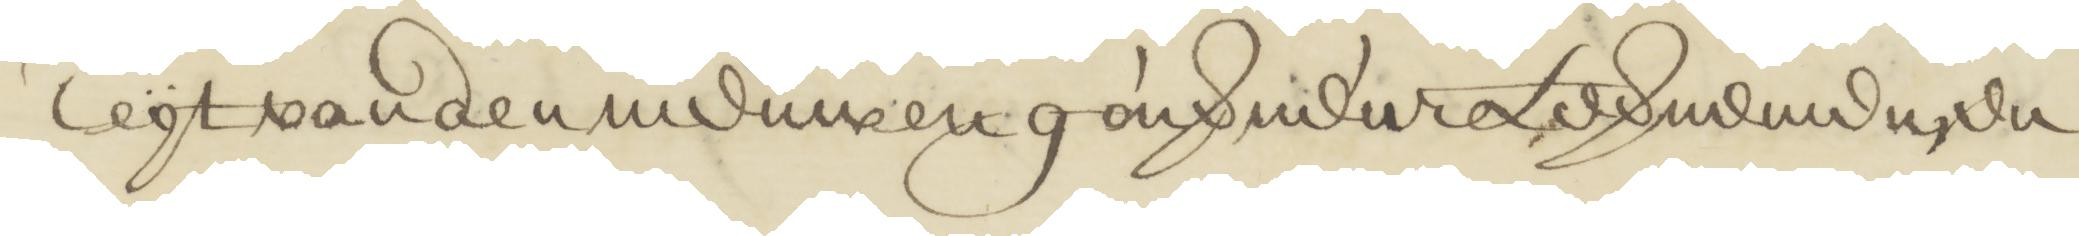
heijt van den nieuwen gouverneur te vernemen, en
